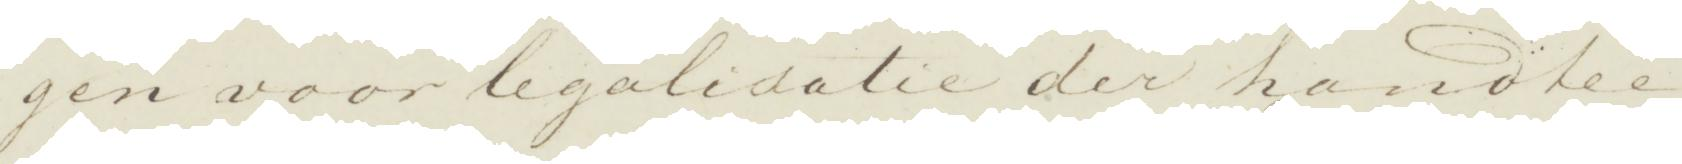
gen voor legalisatie der handtee
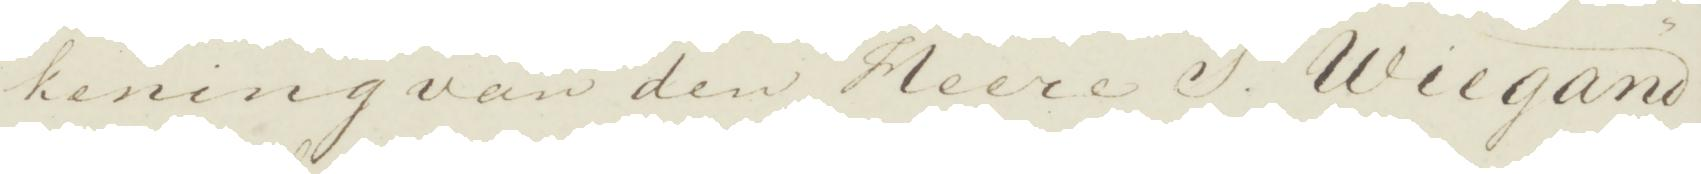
kening van den Heere P. Wiegand
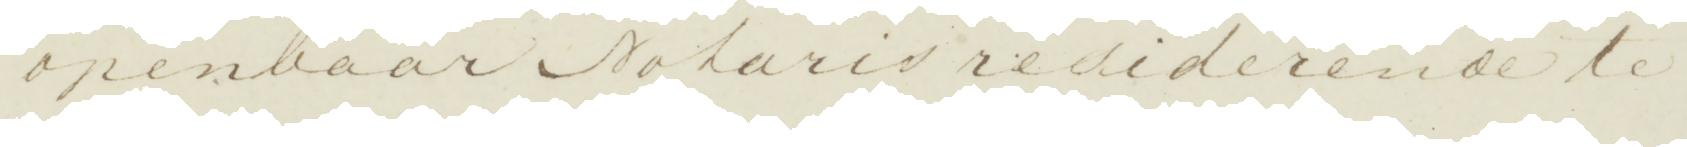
openbaar Notaris residerende te
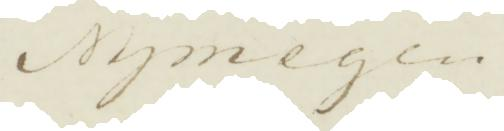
Nymegen
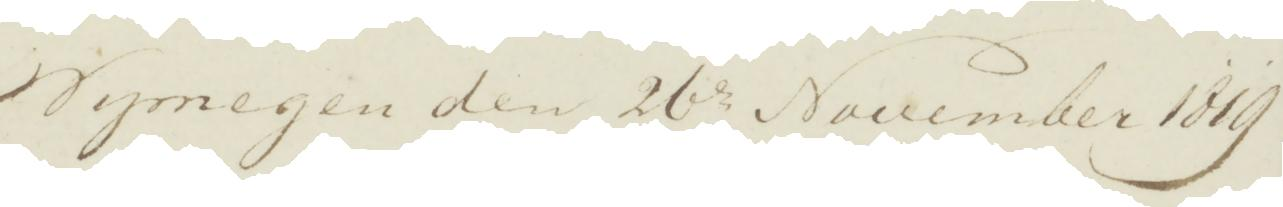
Nymegen den 26:e November 1819
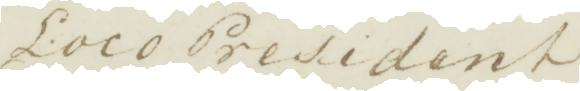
Loco President
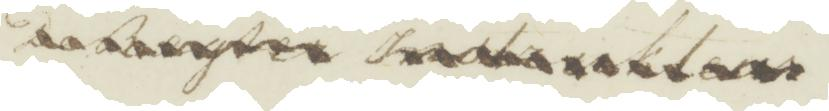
De Regter Instructeur
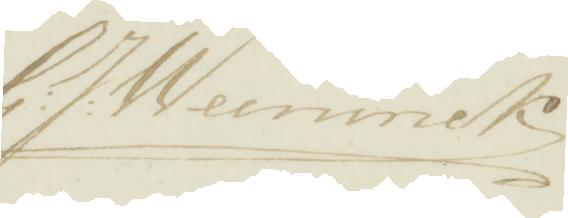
G:J:Weeninck
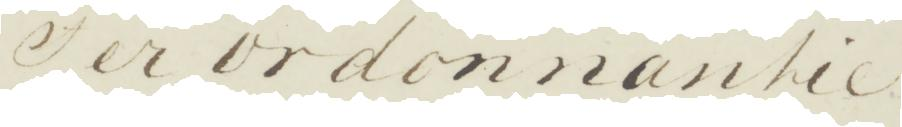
Ter ordonnantie
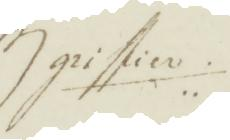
griffier.
